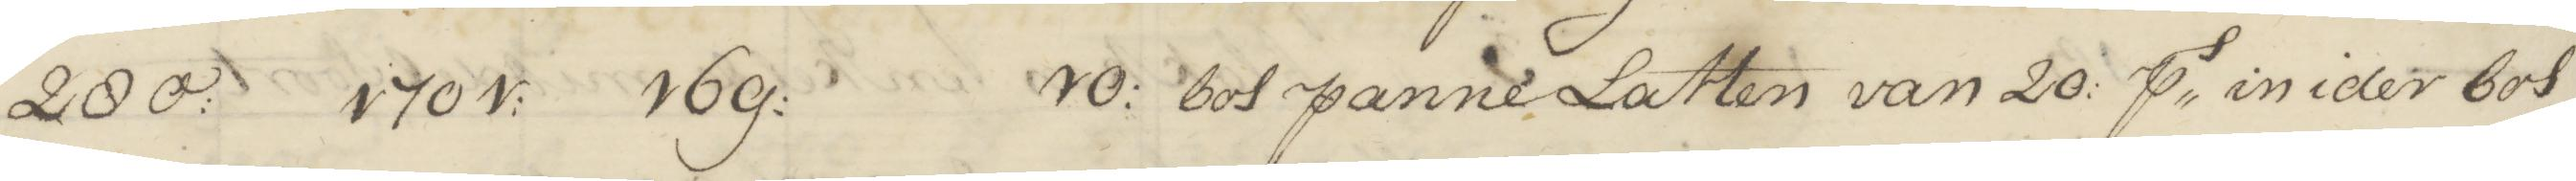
280: 1701: 169: 10: bos panne Latten van 20: p„s in ider bos
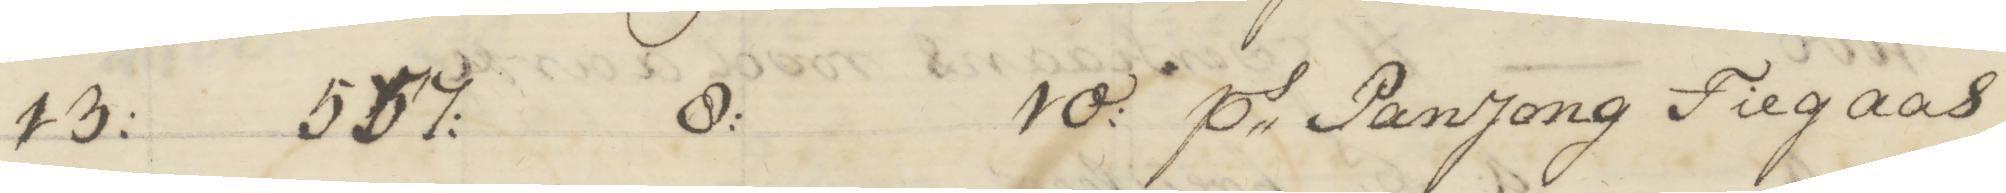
13: 557: 8: 10: p„s Panjong Tiegaas
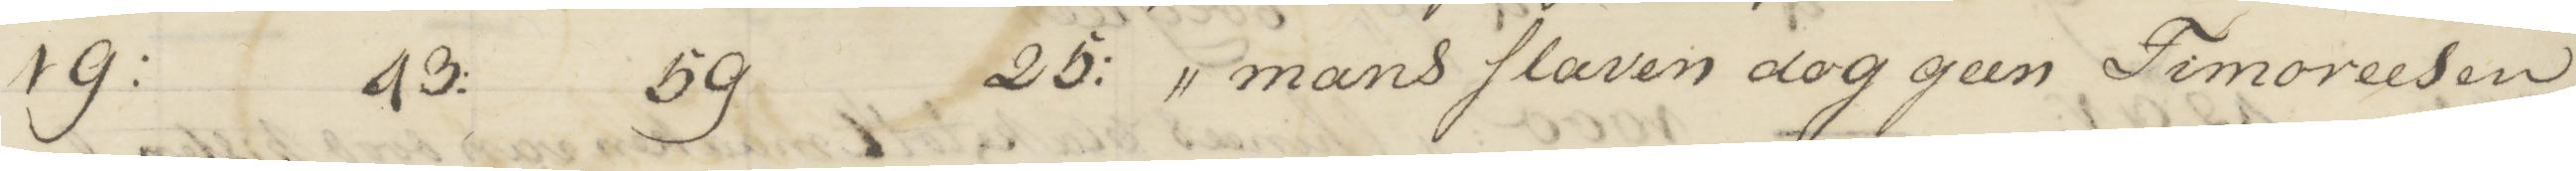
19: 43: 59 25: „ mans slaven dog geen Timoreesen
